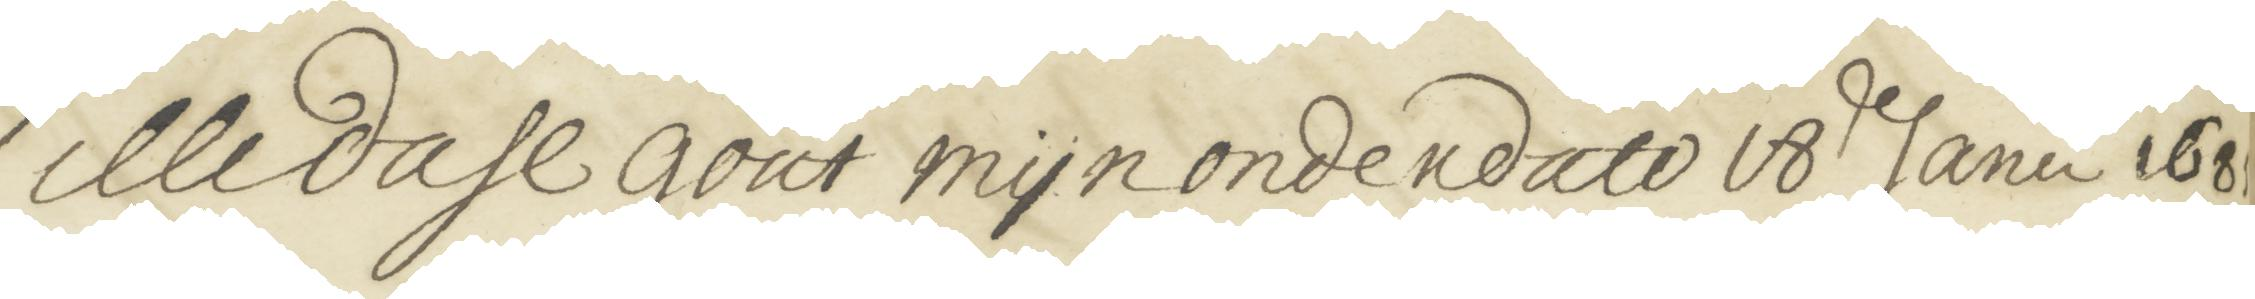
Silledase gout mijn onderdato 18' Janu 168.
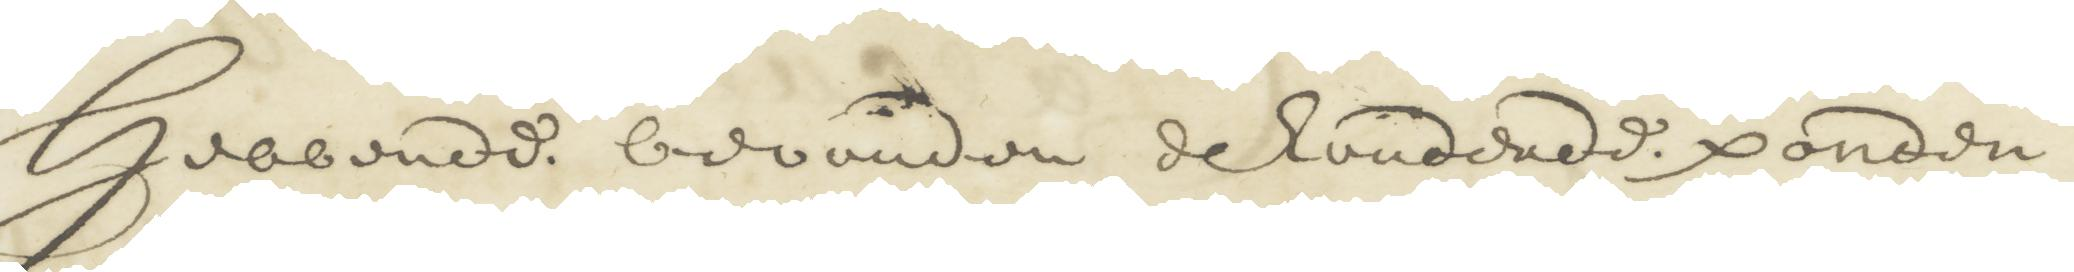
Hebbende. bevonden de honderde. ponden
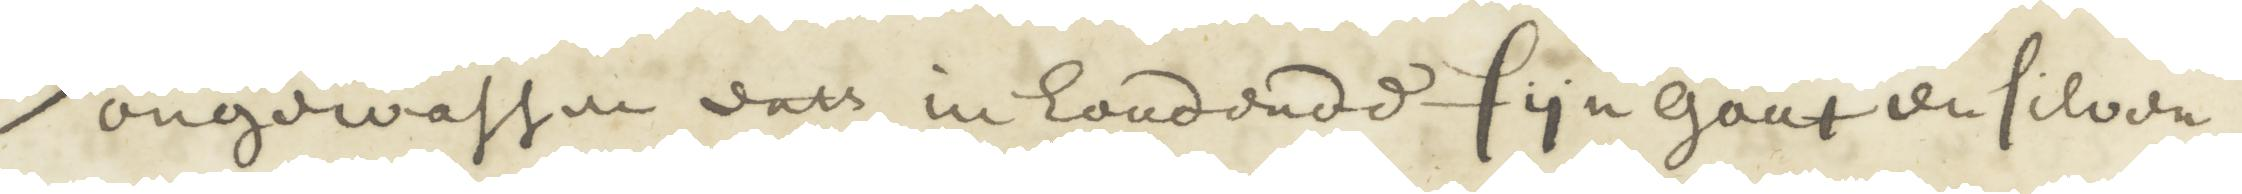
ongewassen erts inhoudende fijn gout en silver
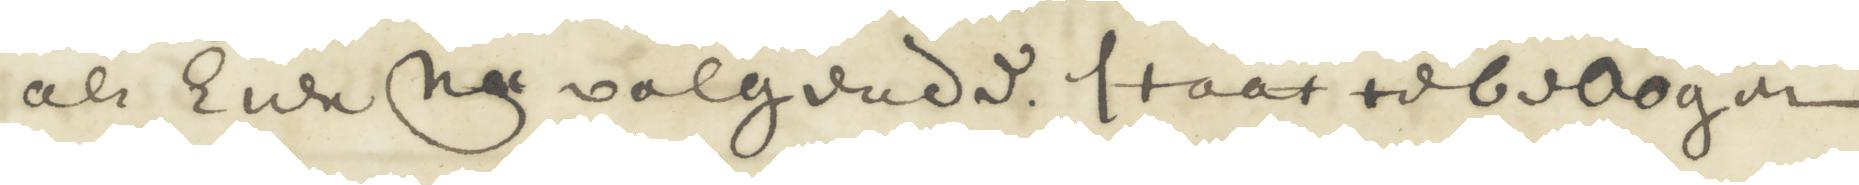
al hier na volgende. staat te beOogen.
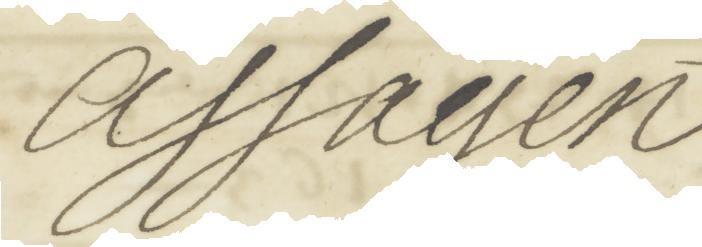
assaijen
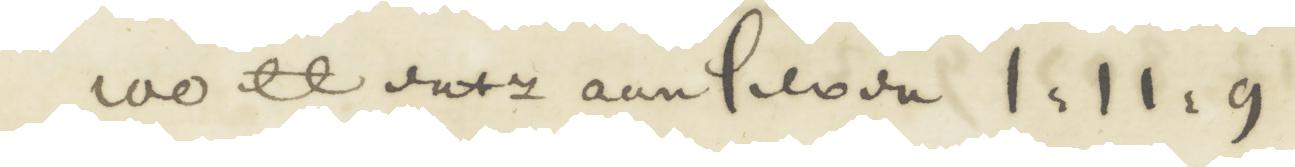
Oudemijn 100 lb ertz aan silver 1:11:9
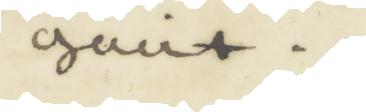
_ . gout . . . . 1:4
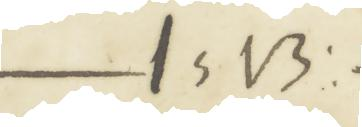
_1:13:-
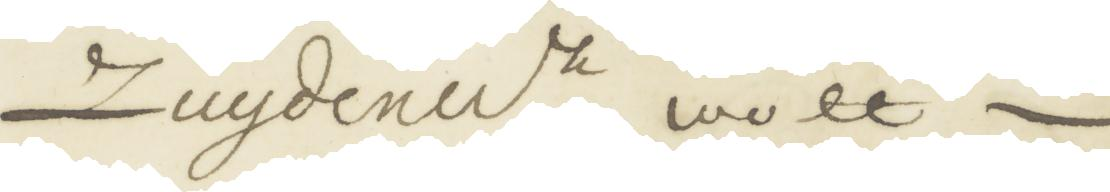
Zuijderw.k 100 lb _ . . . . 1:12:.9
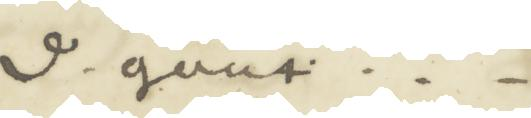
_ . gout. . . - . 1 : -
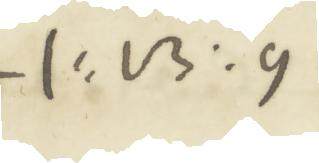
_1:13:9.
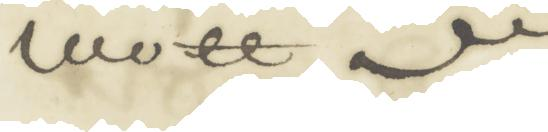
Mal w.k 100 lb _ - - - - 1:12:9
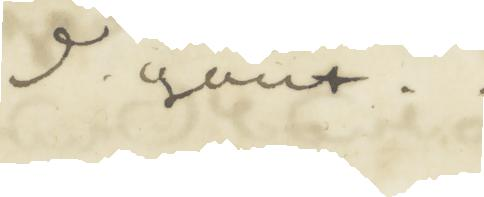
_ . gout. . . . 1:9
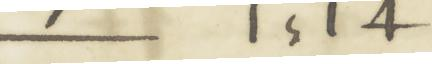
_ 1:14
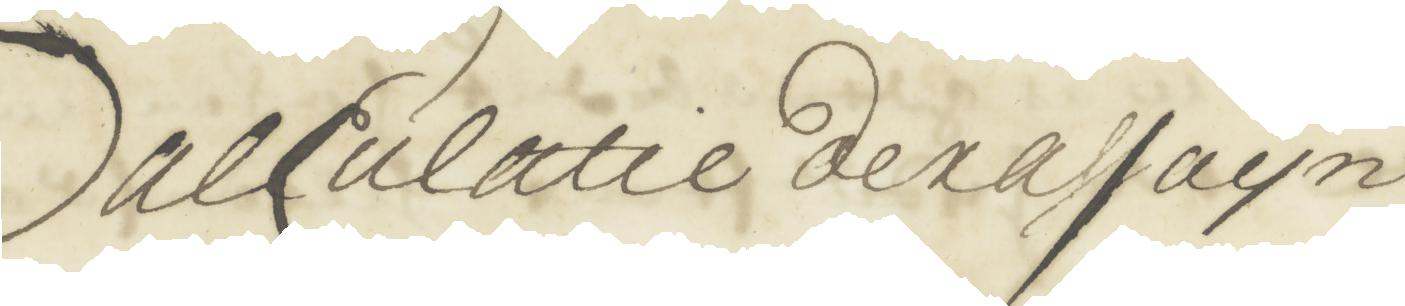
Calculatie derassaijn
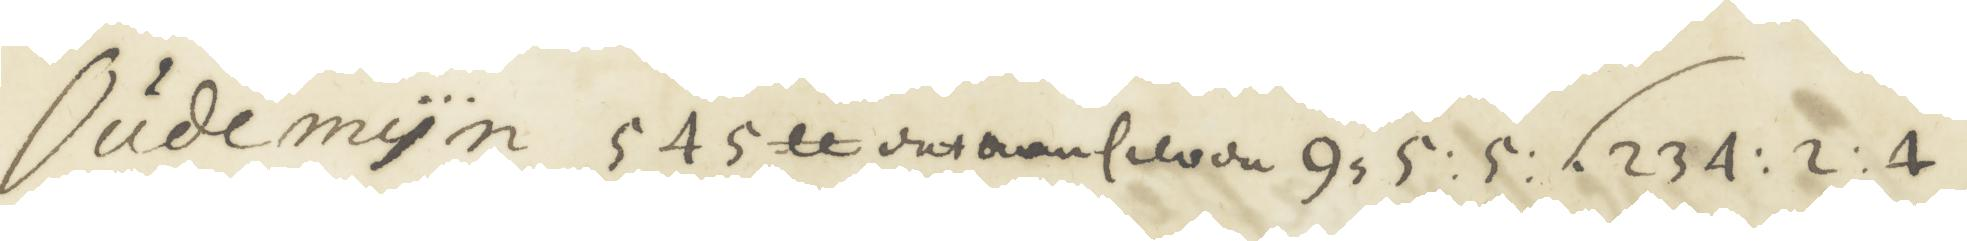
Oude mijn 545 lb ent aan selven 9:5:5: ƒ234:2:4
